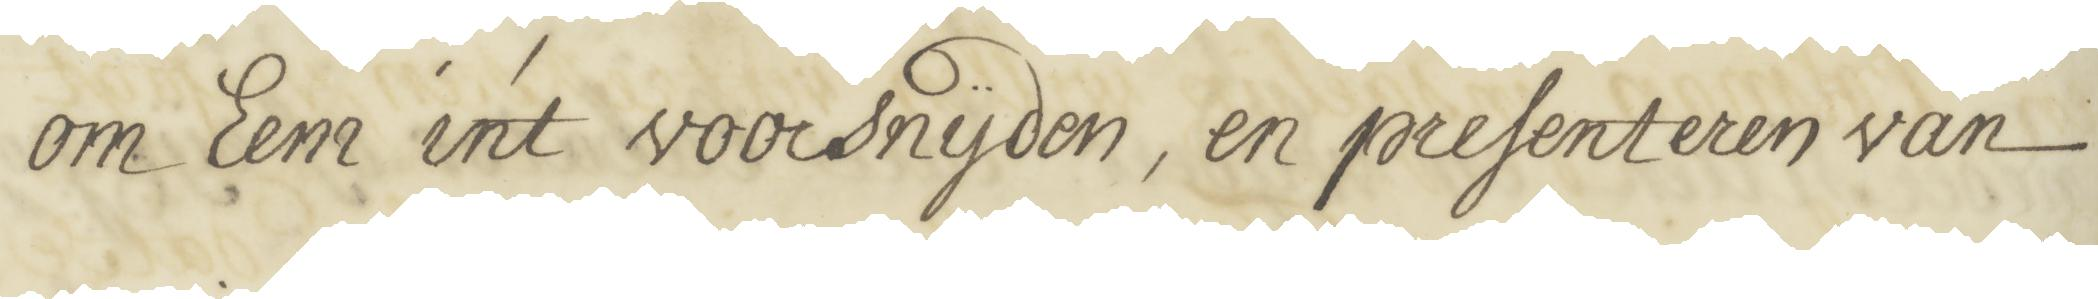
om hem in't voorsnijden, en presenteren van
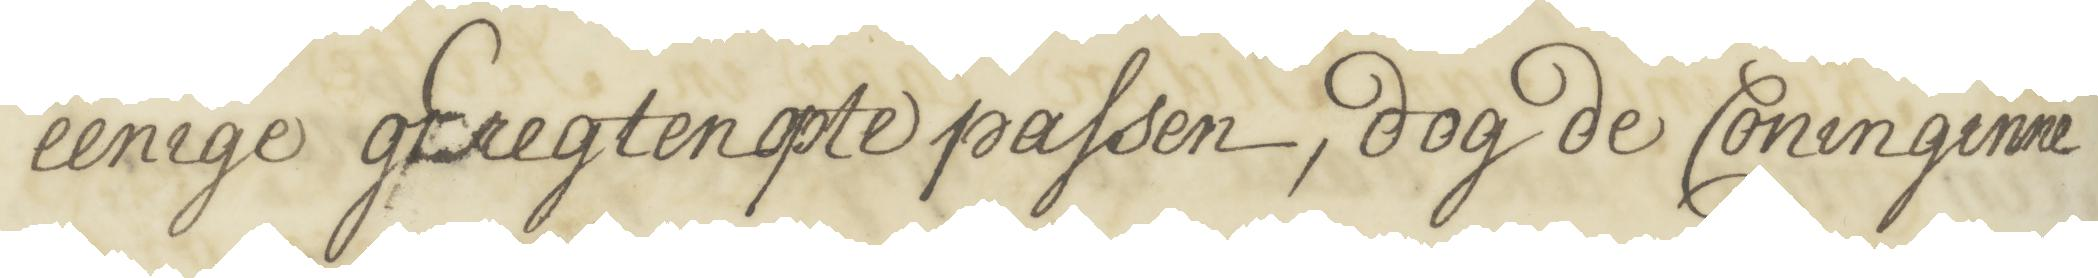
eenige gEregten opte passen, dog de Coninginne
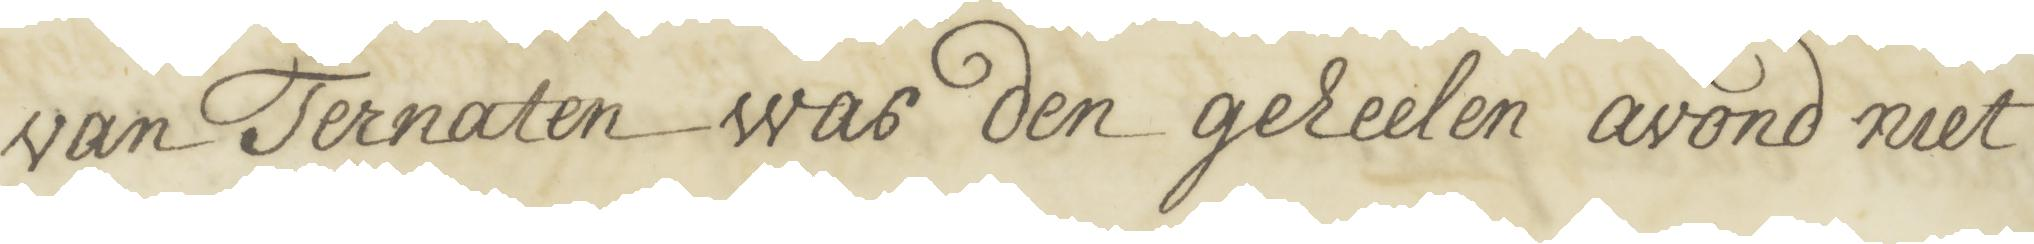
van Ternaten was den geheelen avond niet
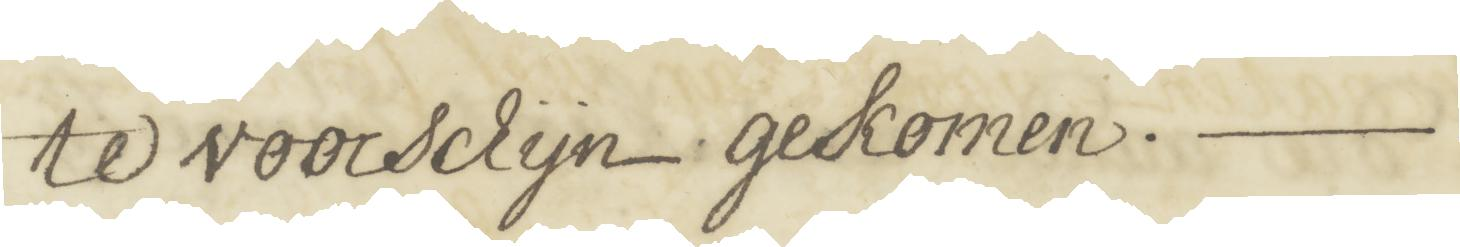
te voorschijn gekomen.—
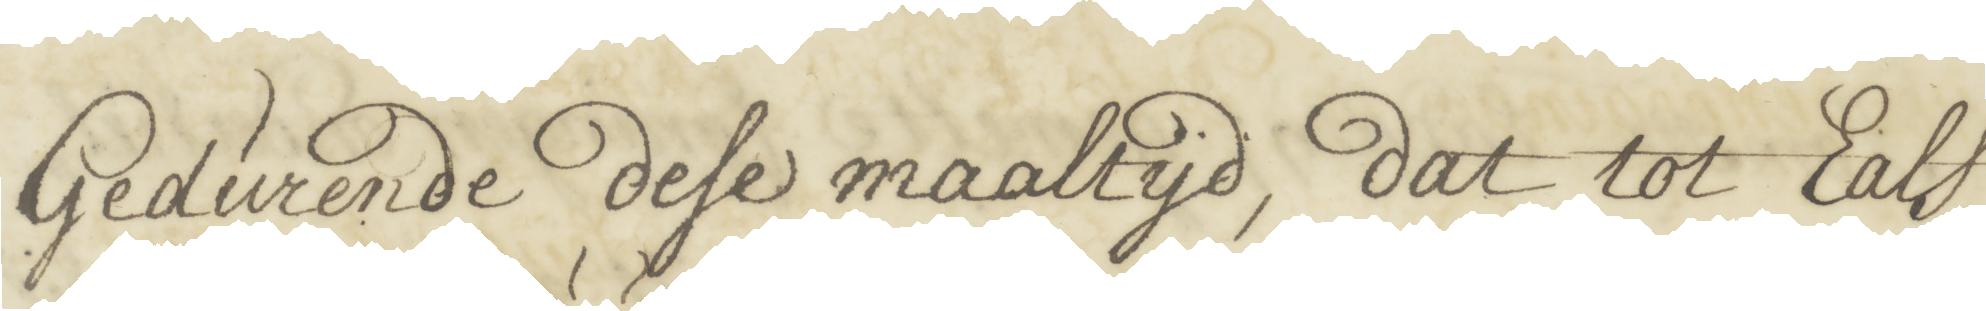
Gedurende dese maaltijd, dat tot half
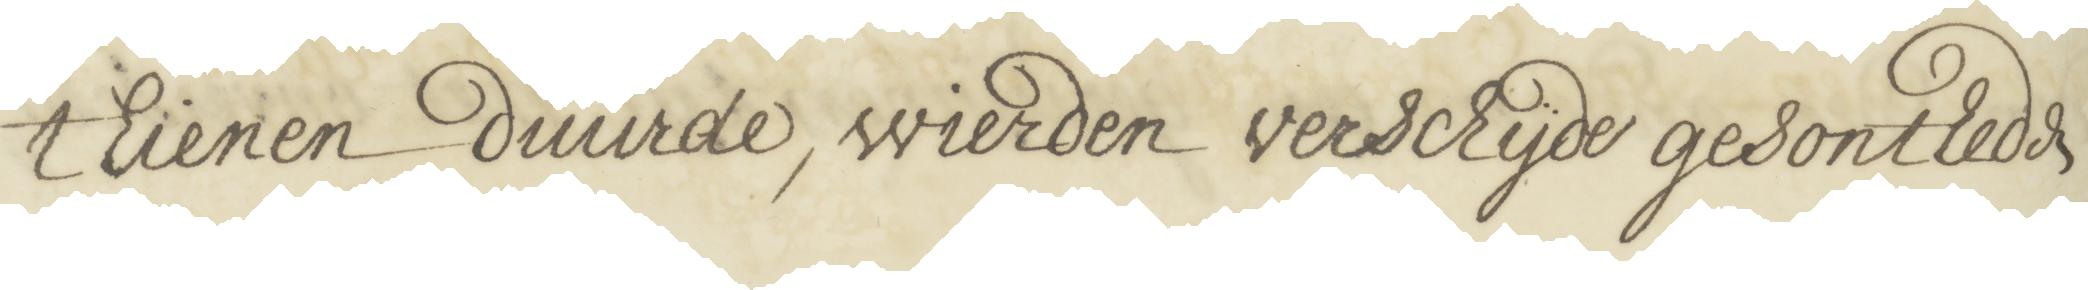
thienen duurde, wierden verschijde gesontheden
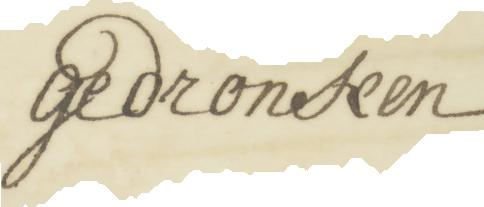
gedronken
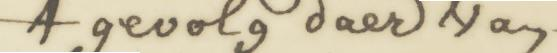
't gevolg daer van
